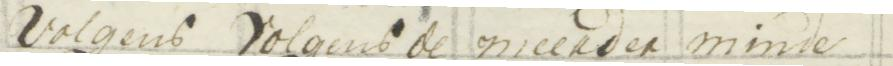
Volgens Volgens de meerder minde
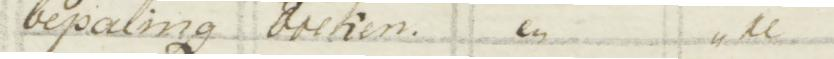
bepaling boeken en „re
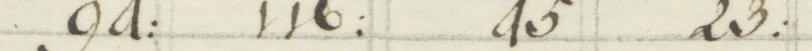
94: 116: 45 23:
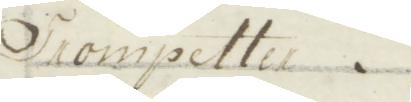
Trompetter .
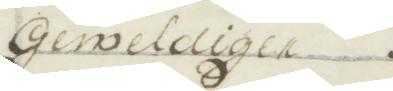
Geweldiger
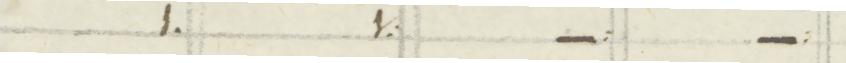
1. 1: —: —:
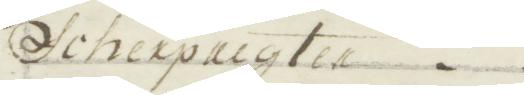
Scherprigter .
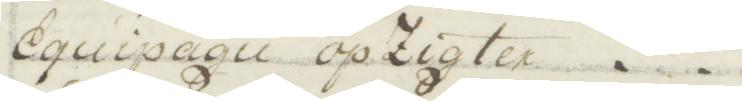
Equipagie op Zigter . .
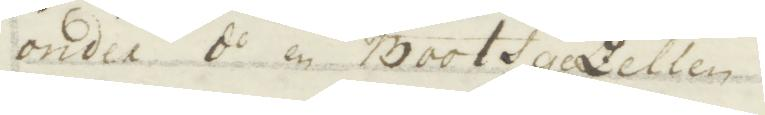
onder do en Bootsgezellen
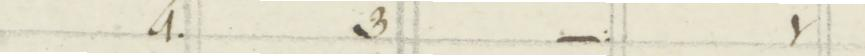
4. 3 —: 1
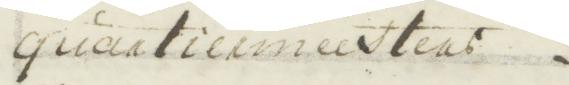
quartiermeesters
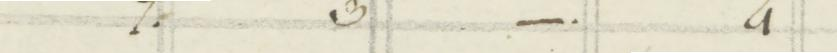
7. 3 —. 4
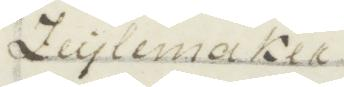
Zeijlemaker
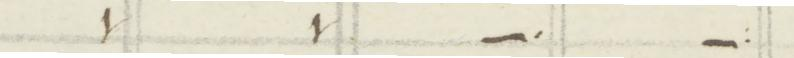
1 1 —. —:
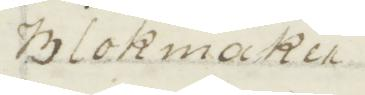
Blokmaker
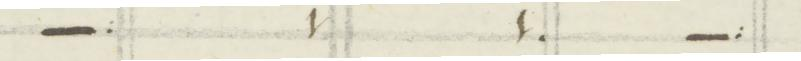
—: 1 1. —:
